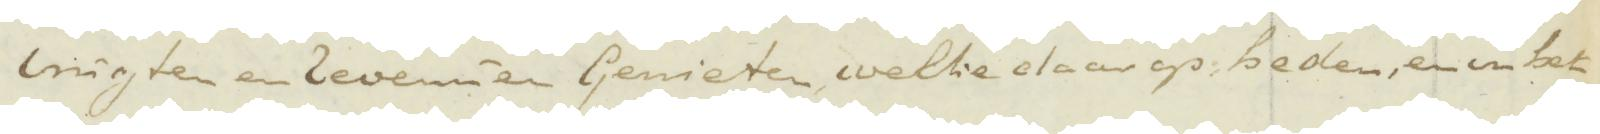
vrugten en revenuen Genieten, welke daar op heden, en in het
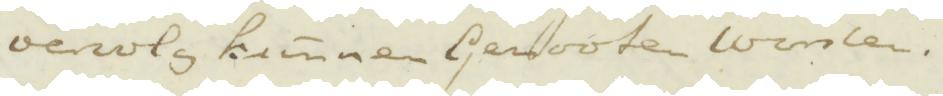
vervolg kunnen Genoote worden.
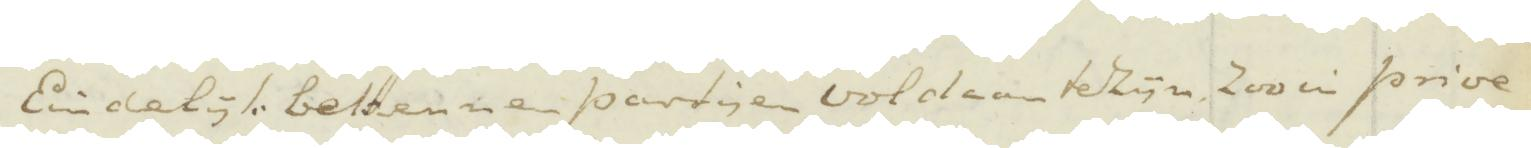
Eindelijk bekenne partijen voldaan te zijn, zoo in prive
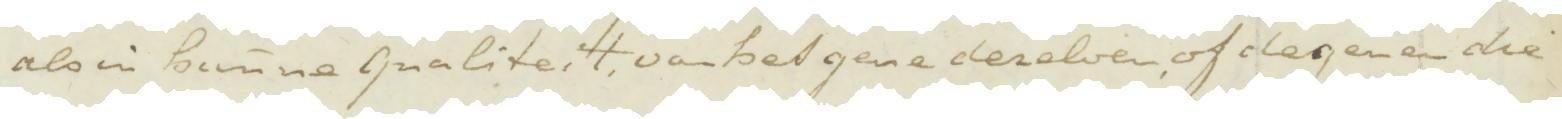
als in hunne qualiteit, van het gene dezelven, of degenen die
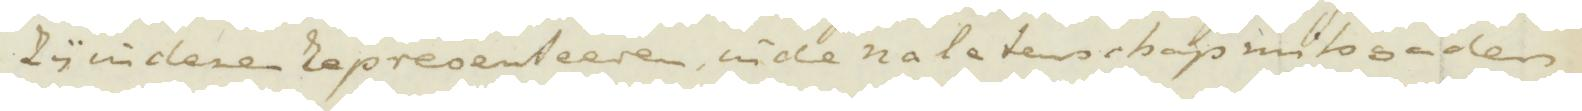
zij in dezen representeeren, in de nalatenschap mitsgaders
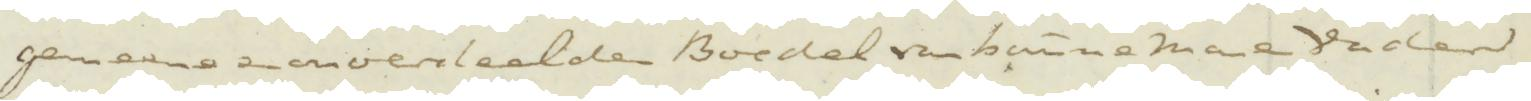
gemeene en onverdeelde Boedel van hunne mae vader
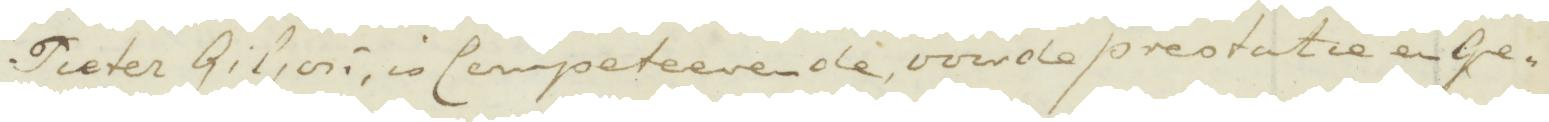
Pieter Giljou, is Competeerende, voor de prestatie en Ge„
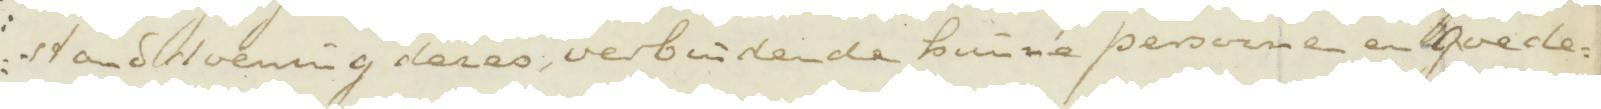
„standdoening dezes, verbindende hunne persoonen en Goede=
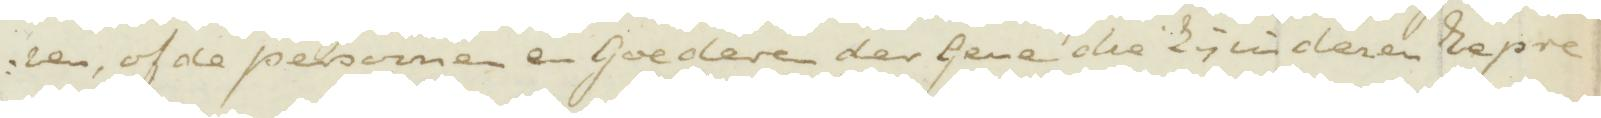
=re, of de persoonen en Goederen der Gene die zij in dezen repre
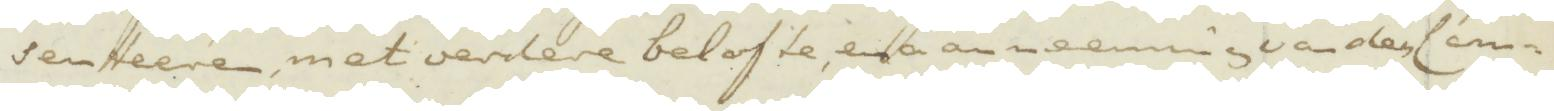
=senteeren, met verdere belofte, en aanneeming van den Com=
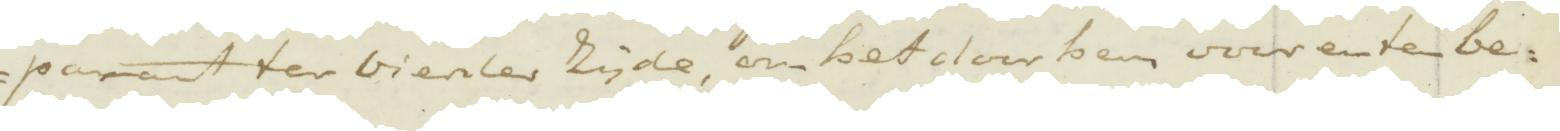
=parant ten vierdens zijde, en het door hem voor en ten be=
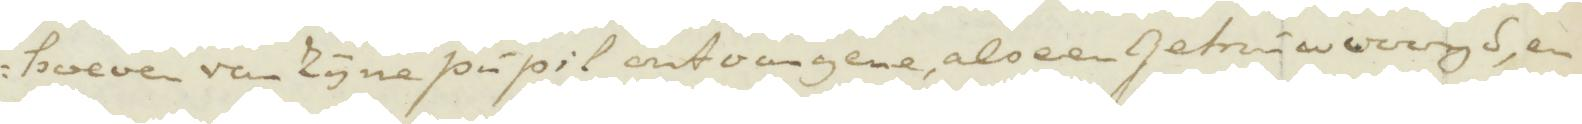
=hoeve van zijne pupil ontvangene, als een Getrouw voogd, en
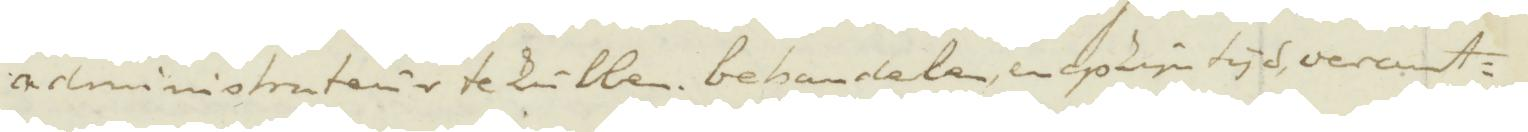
administrateur te zullen, behandelen, en opzijn tijd, verant=
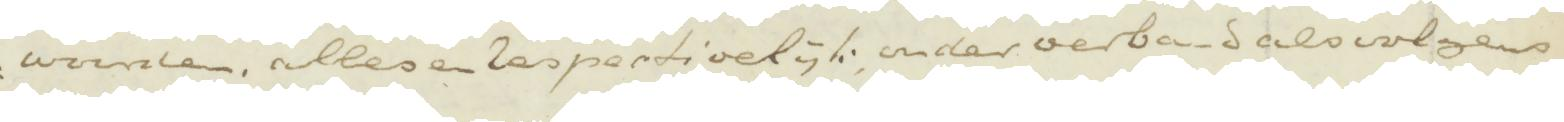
=woorden, alles en respectivelijk, onder verband als volgens
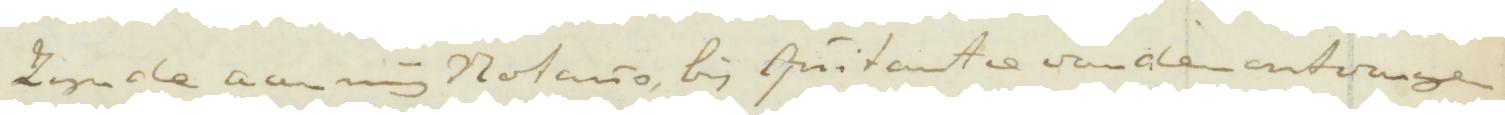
Zynde aan mij Notaris, bij quitantie van den ontvangen
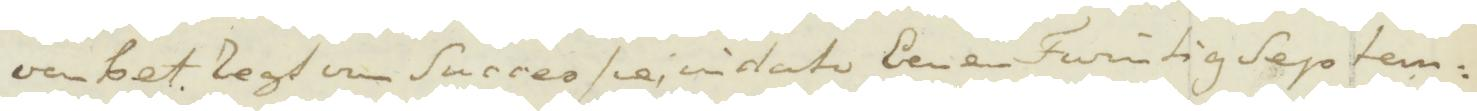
van het regt van successie; in dat Een en Twintig Septem=
